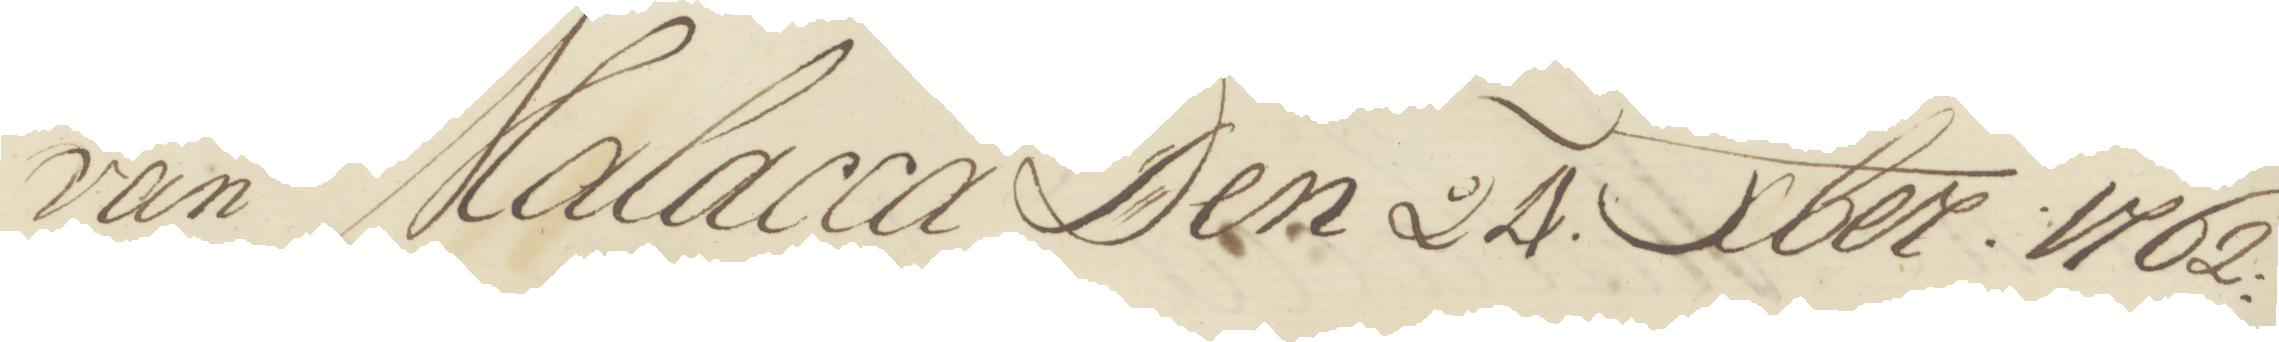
van Malacca Den 24.' xber: 1762:
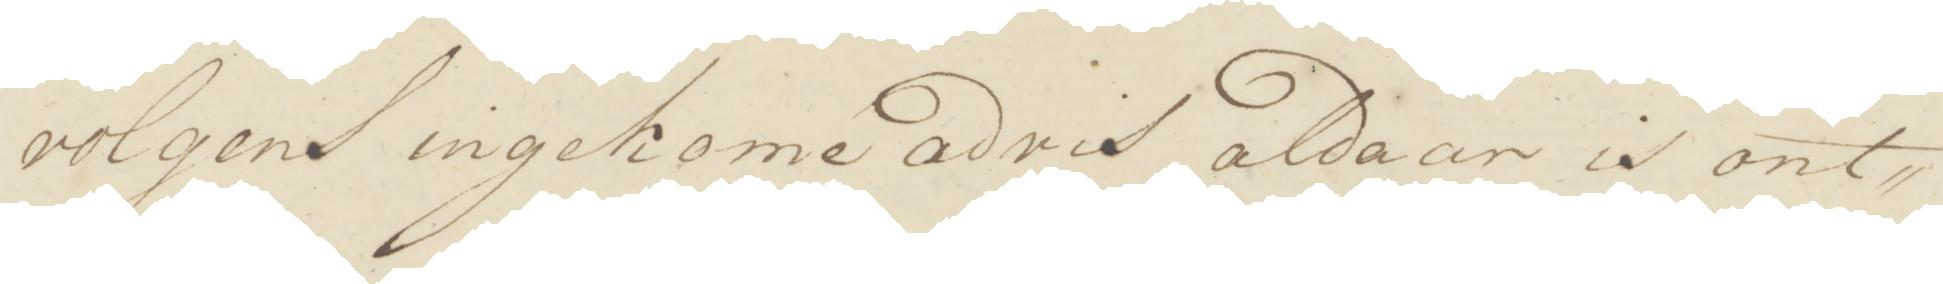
volgens ingekome advis aldaar is ont„
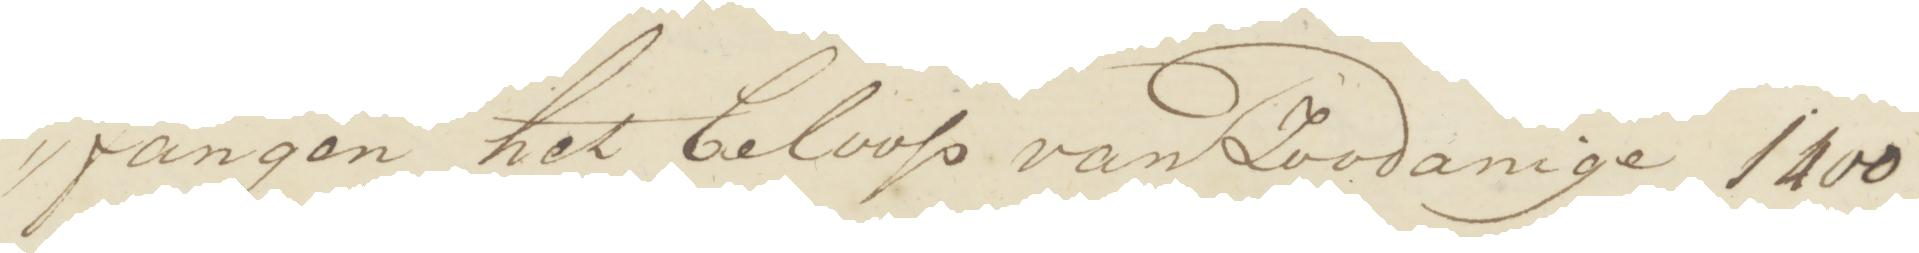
„fangen het beloop van zoodanige 1400
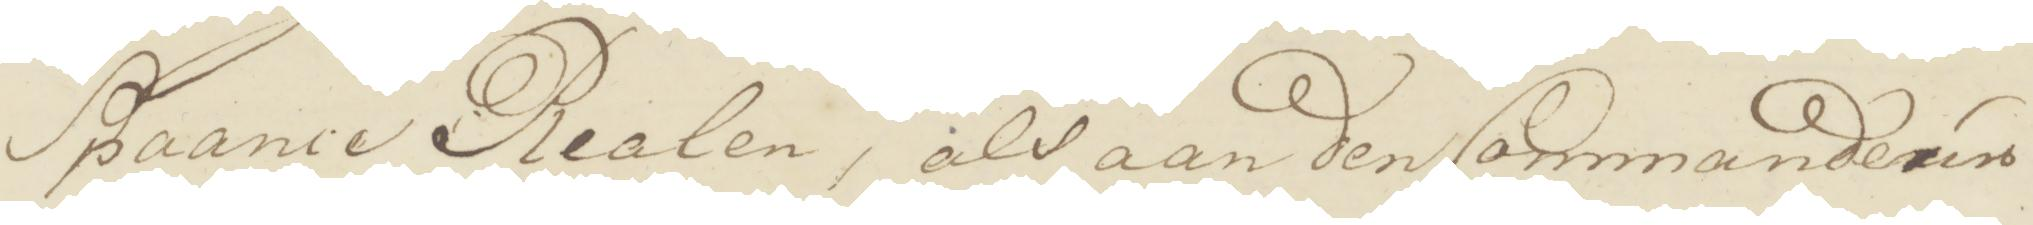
Spaance Realen, als aan den Commandeur
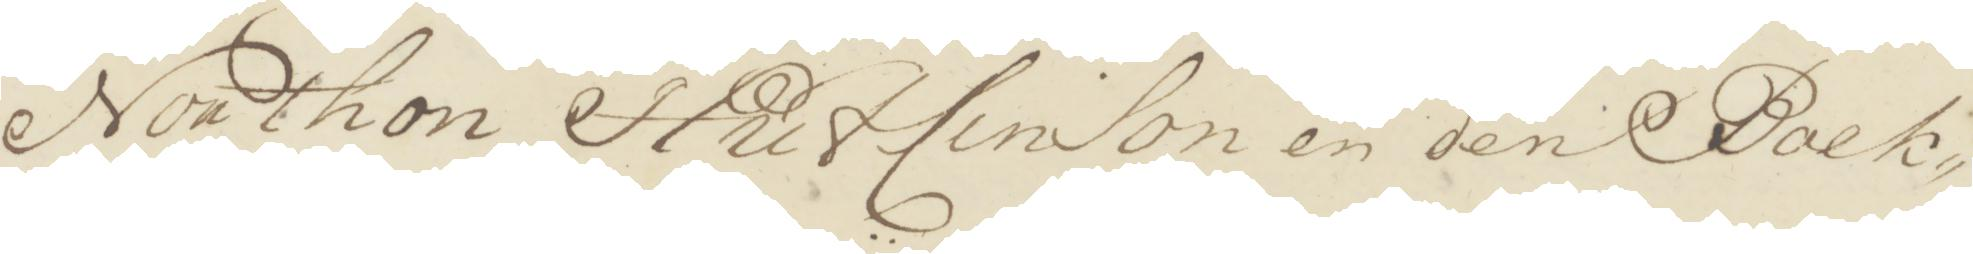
Northon Hutcinson en den Boek„
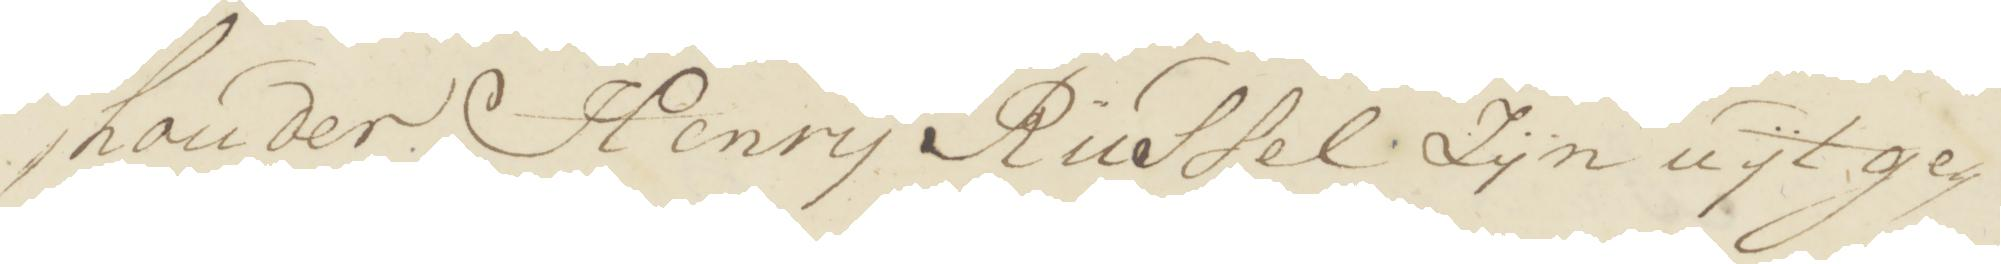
„houder Henrij Russel zijn uijt ge„
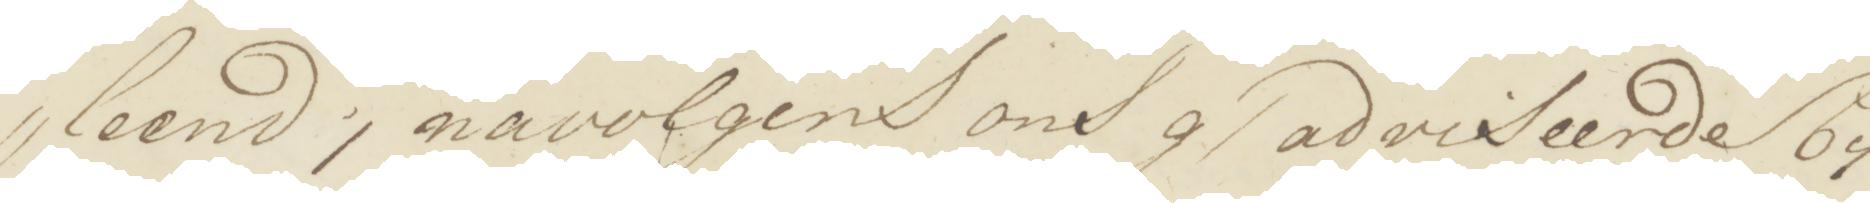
„leend, navolgens ons g’adviseerde bij
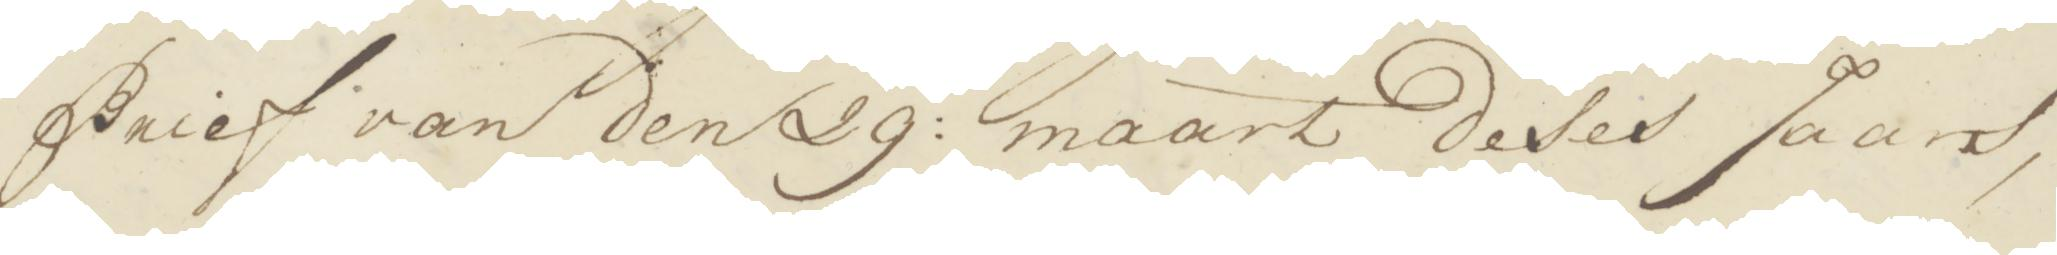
Brief van den 29: maart deses Jaars,
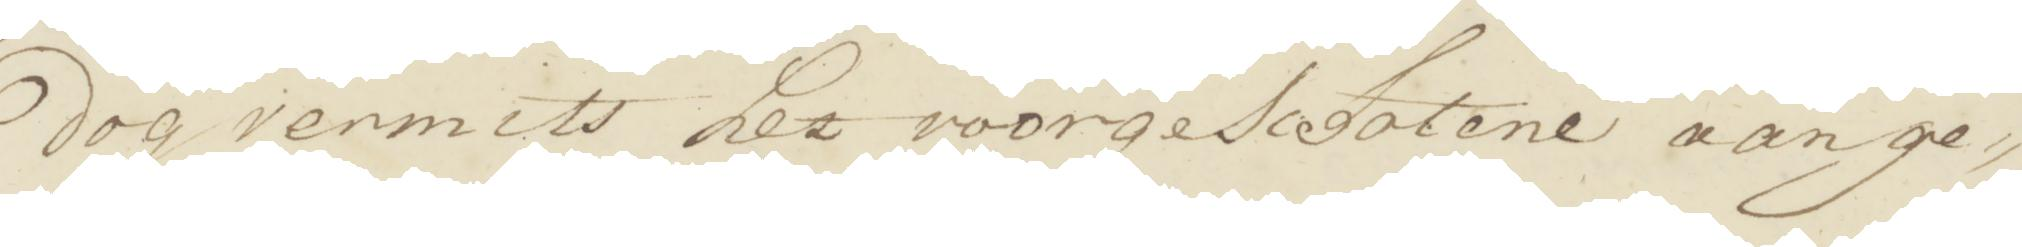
dog vermits het voorgeschotene aan ge„
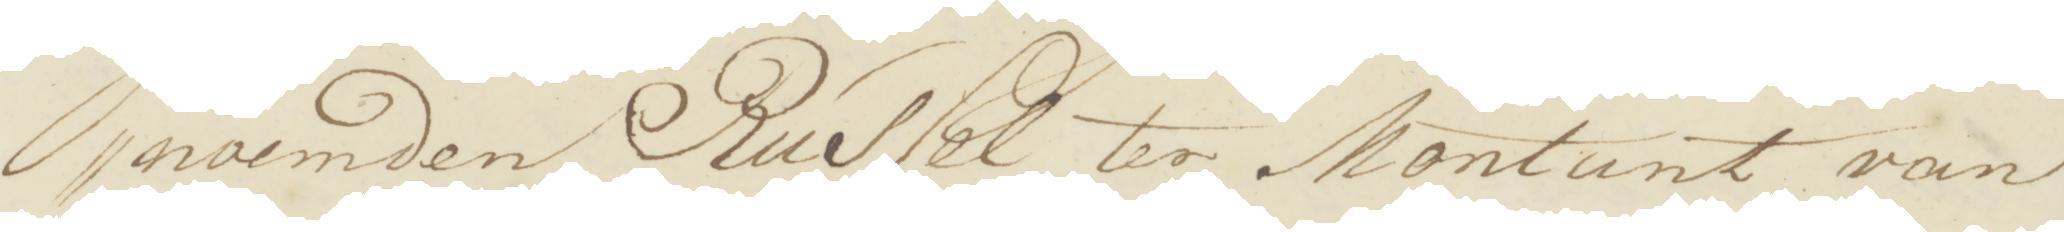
„noemden Russel ter Montant van
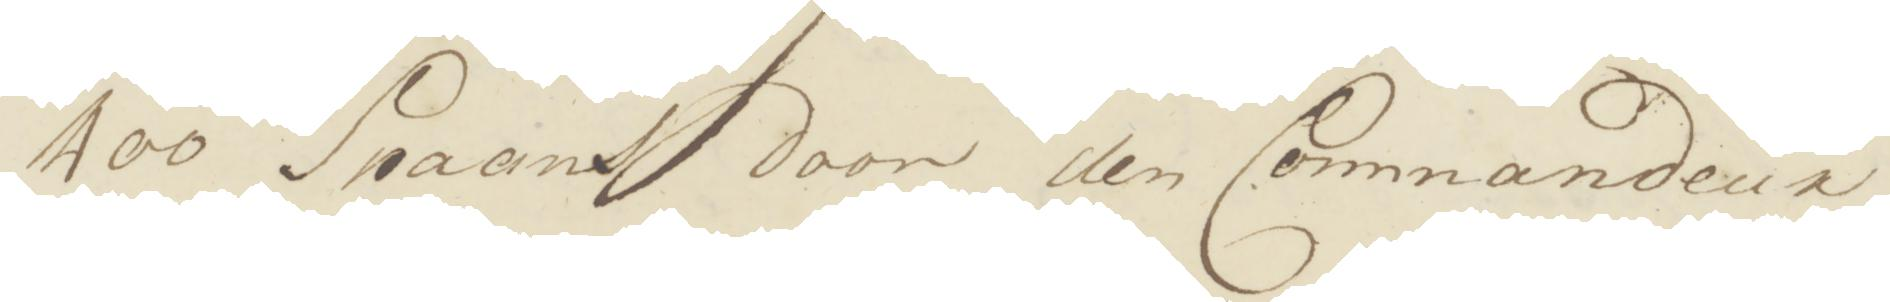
1400 spaans door den Commandeur
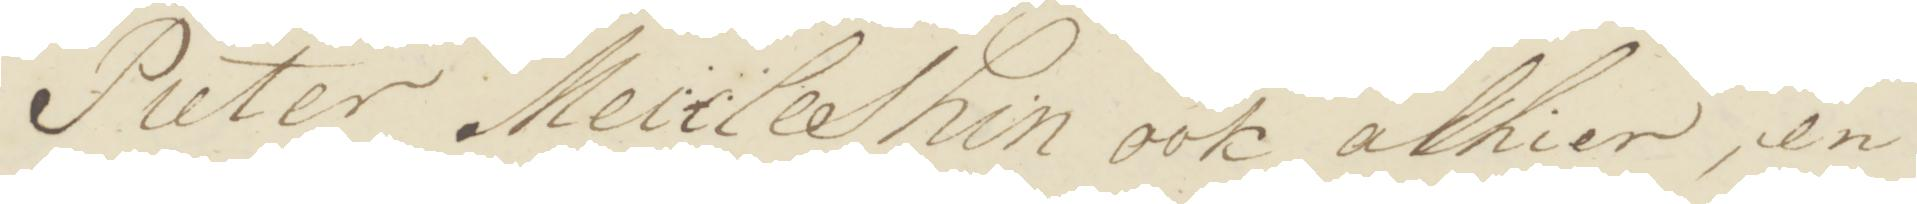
Pieter Meccleeshin ook alhier, en
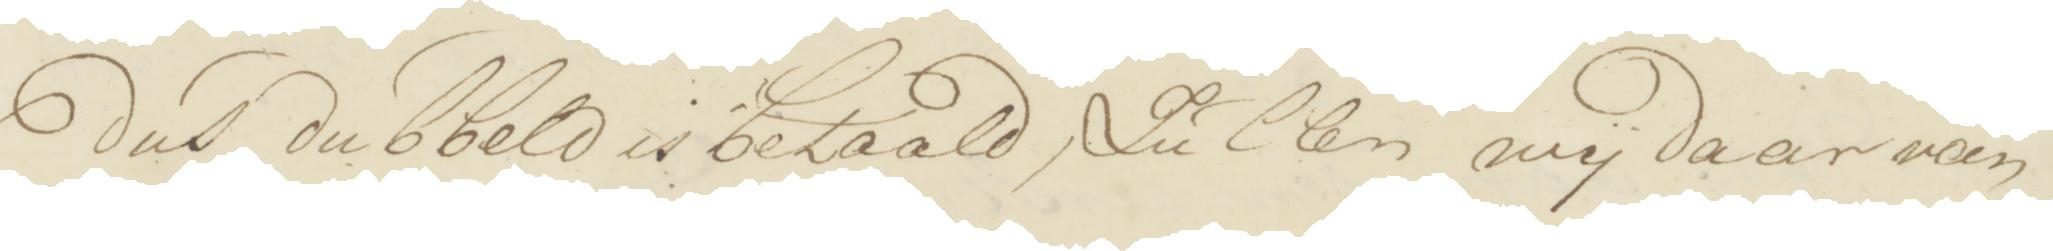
dus dubbeld is betaald, zullen mij daar van
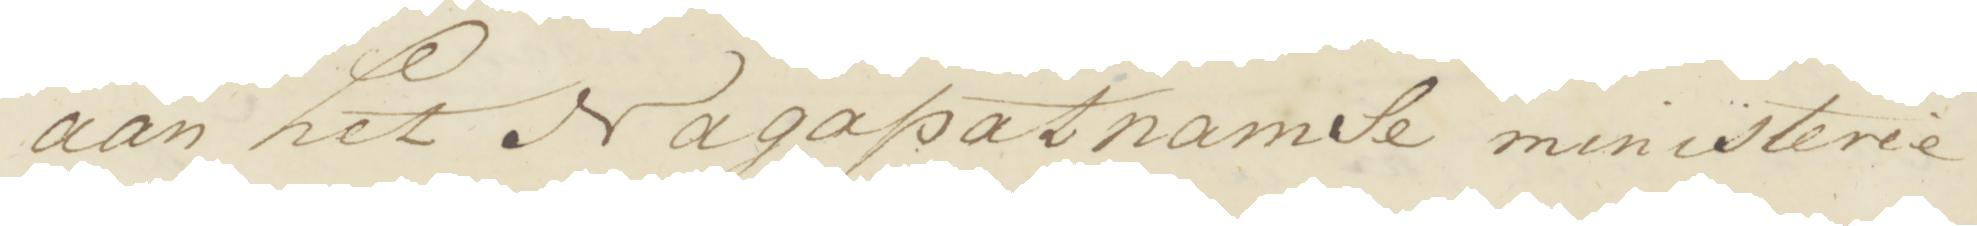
aan het Nagapatnamse ministerie
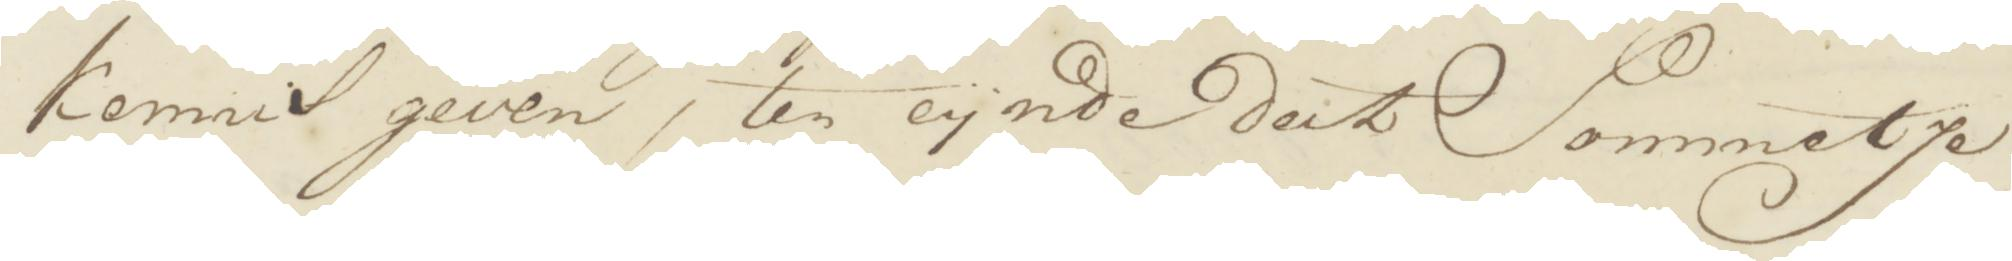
kennis geven, ten eijnde dat Sommetje
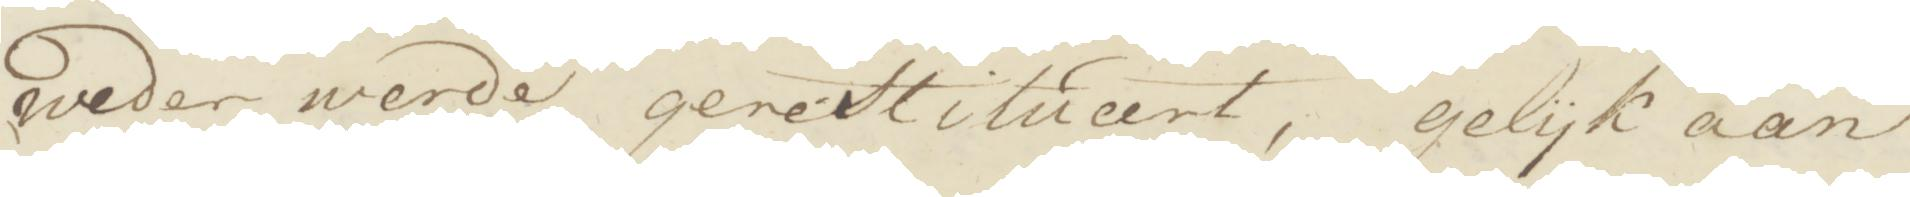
weder werde gerestitueert, gelijk aan
